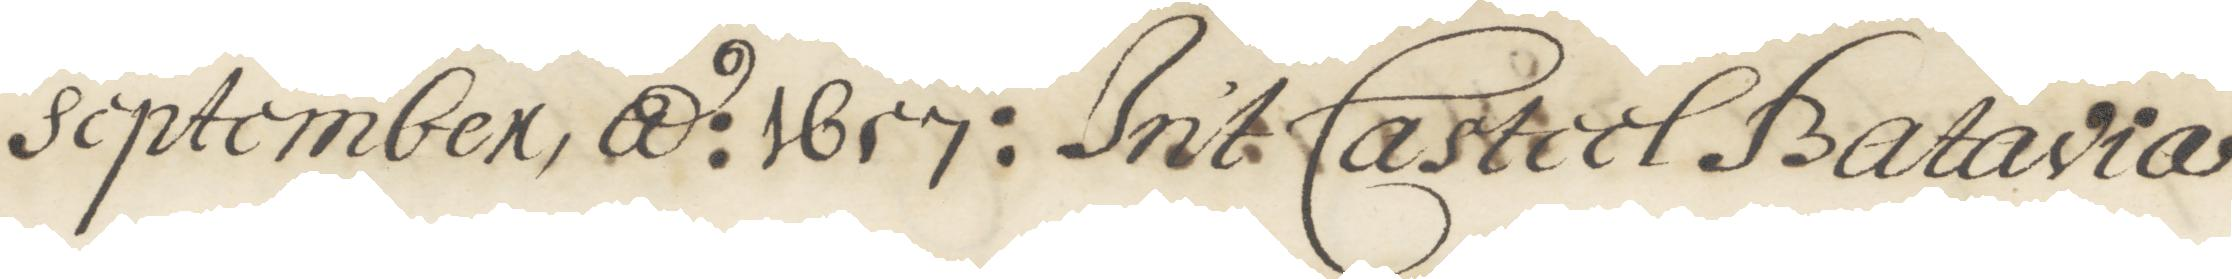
september, a:o 1657: In ’t Casteel Batavia
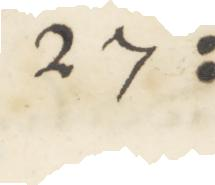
27:
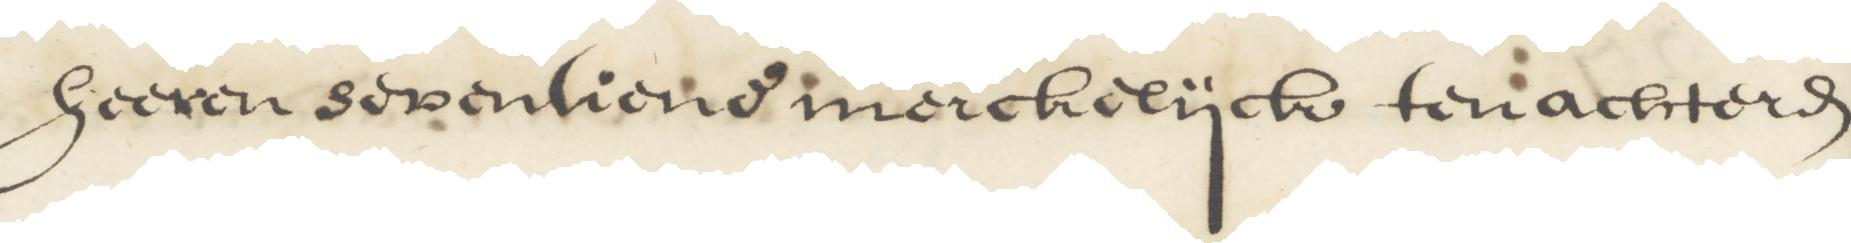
heeren seventiene merckelijck ten achteren
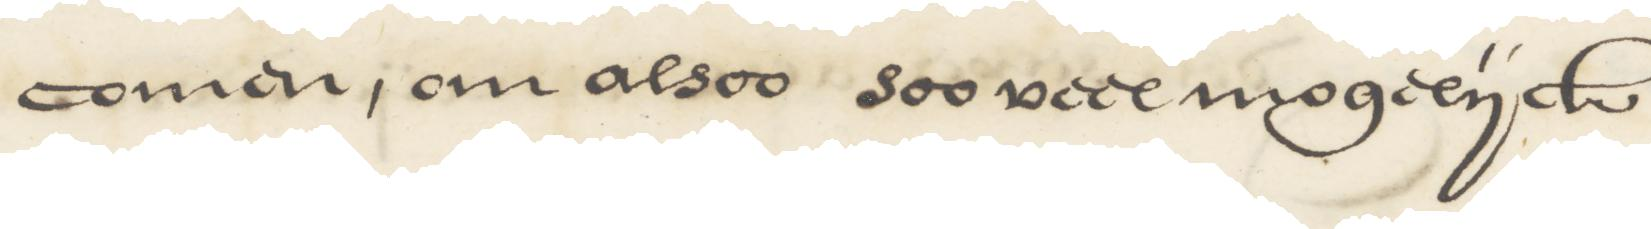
comen, om alsoo soo veel mogelijck
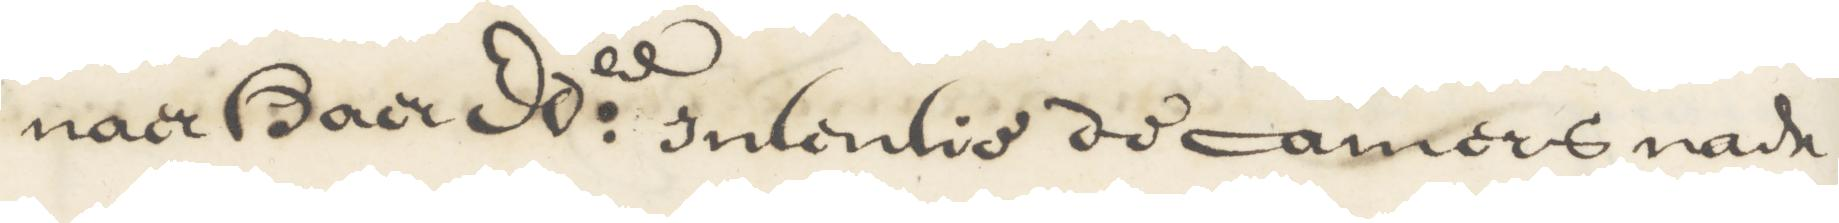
naer haer Ed:le intentie de camers naer
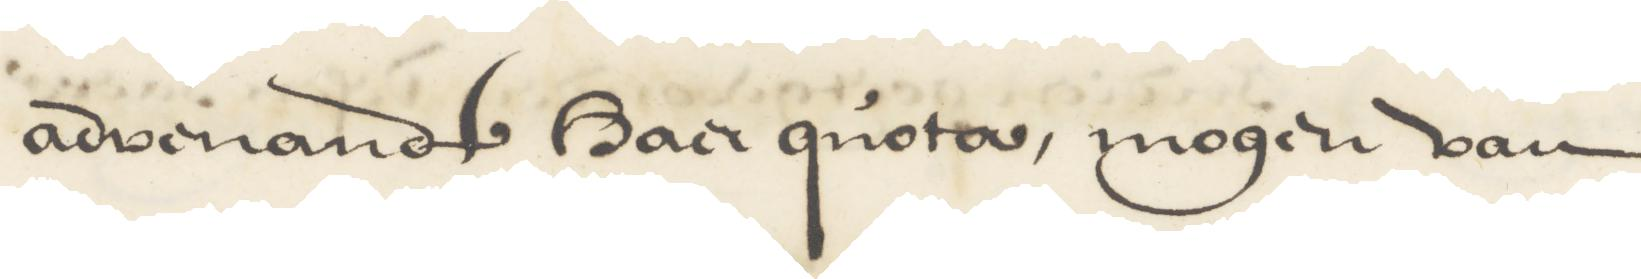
advenandt haer quota, mogen van
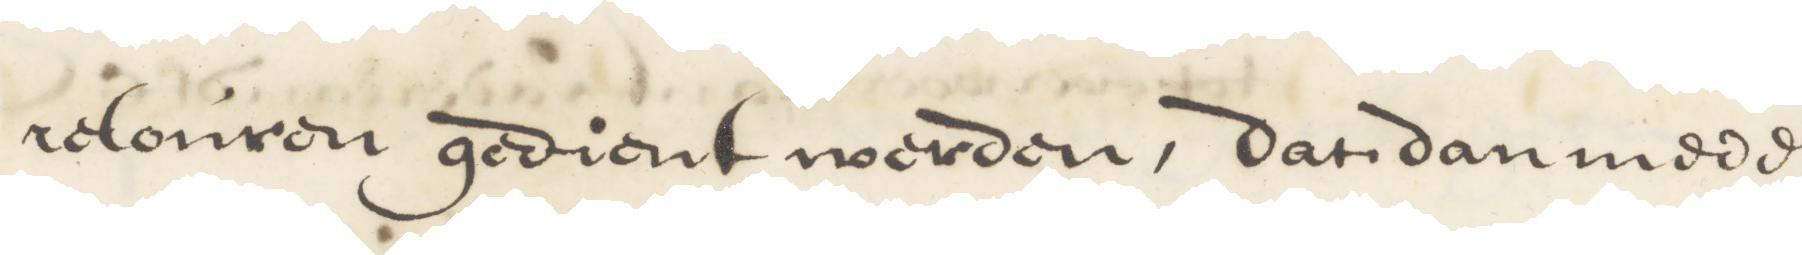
retouren gedient werden, dat dan mede
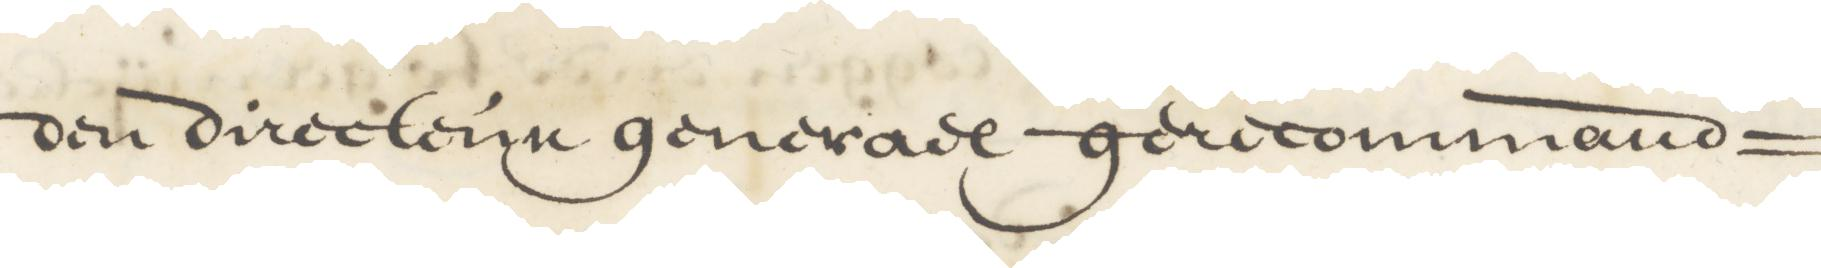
den directeur generael gerecommand=t
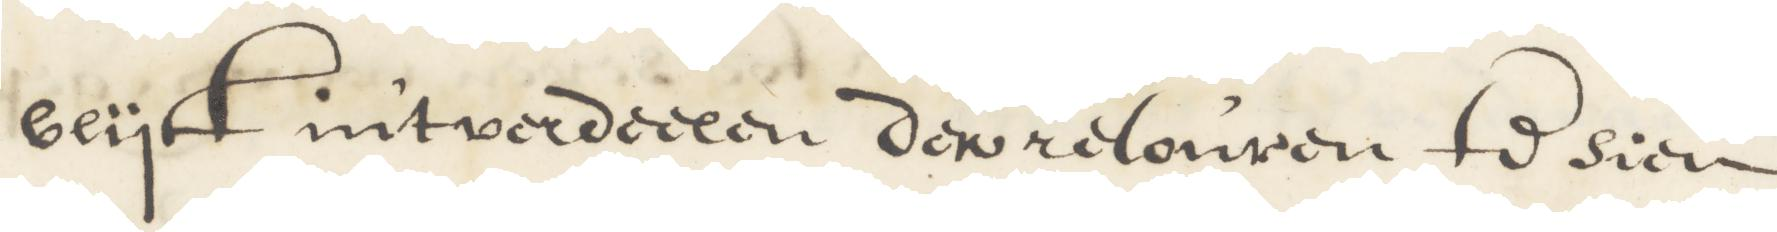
blijft in ’t verdeelen der retouren te sien
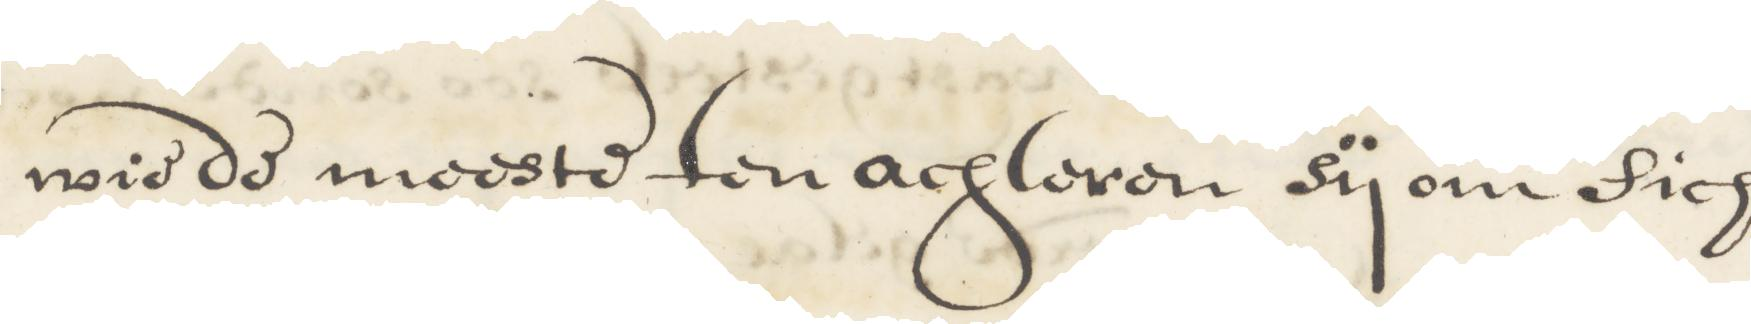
wie de meeste ten achteren sij om sich
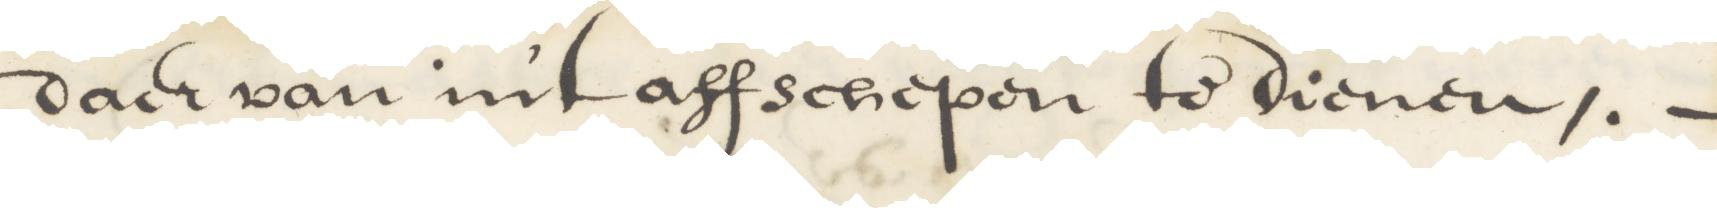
daer van in ’t affschepen te dienen /.
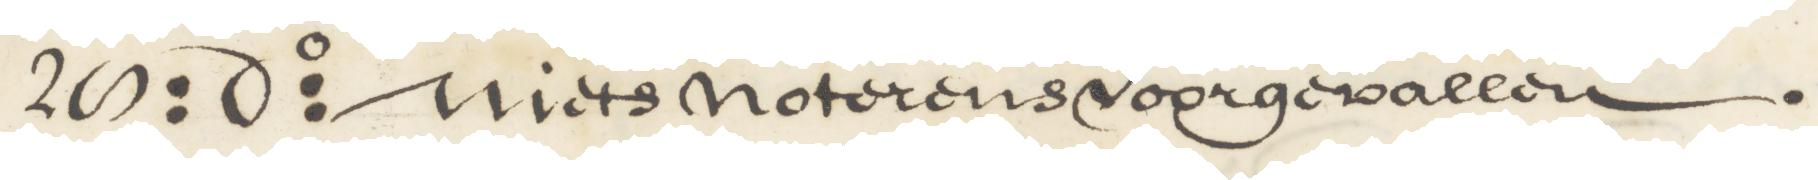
28: d:o niets noterens voorgevallen.
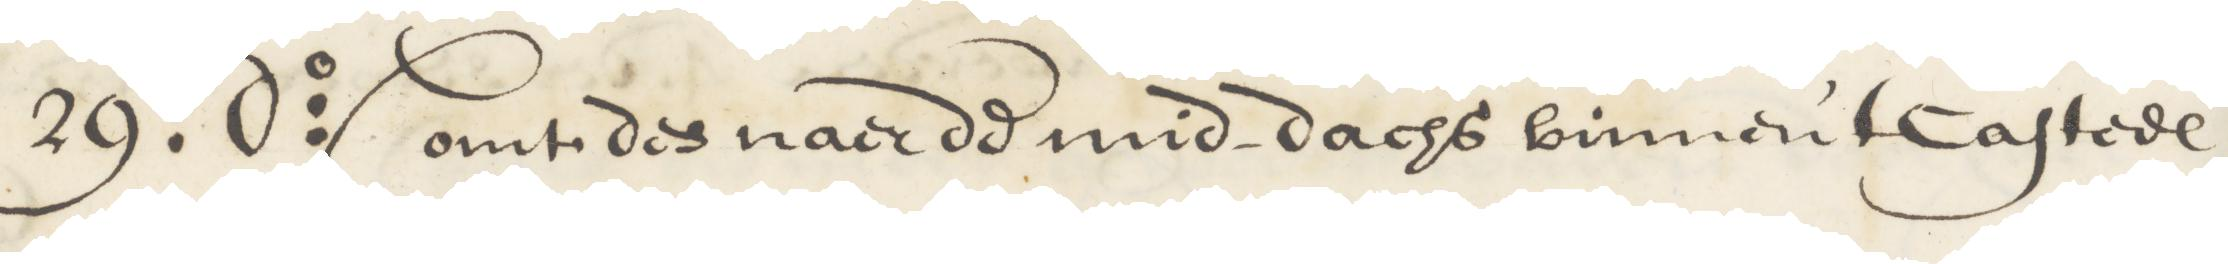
29: d:o Comt des naer de mid-dachs binnen ’t Casteel
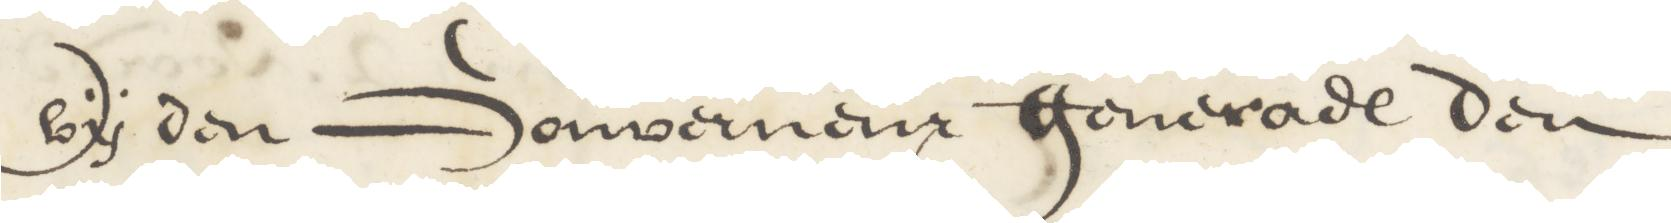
bij den Gouverneur generael den
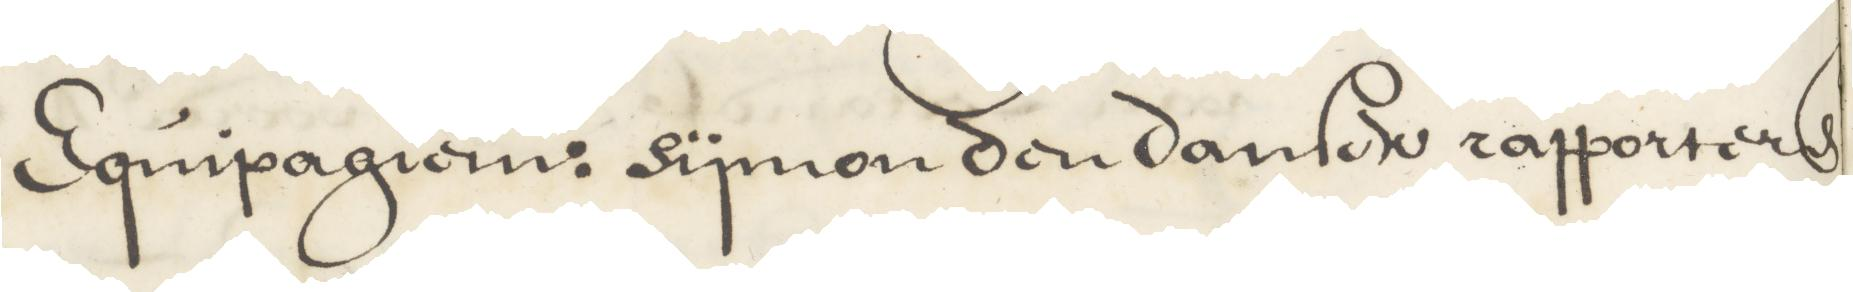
Equipagiem:en sijmon den danser rapporteren
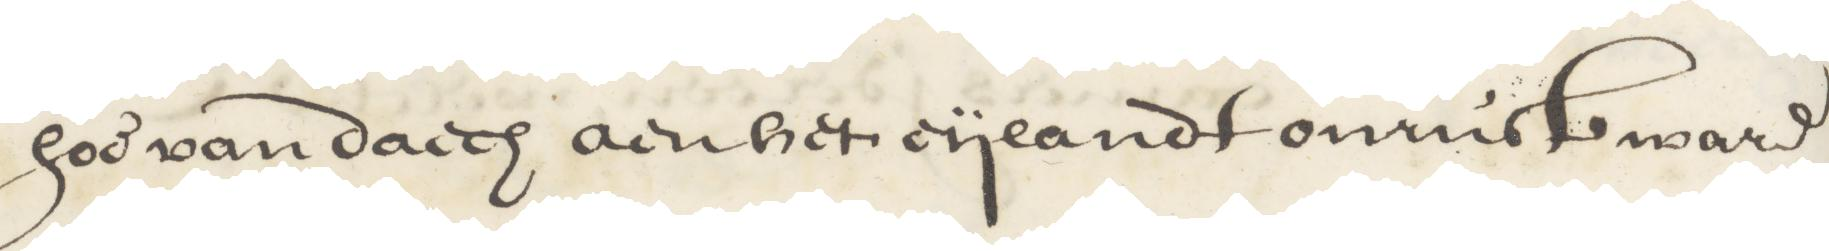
hoe van daech aen het eijlandt onrust ware
